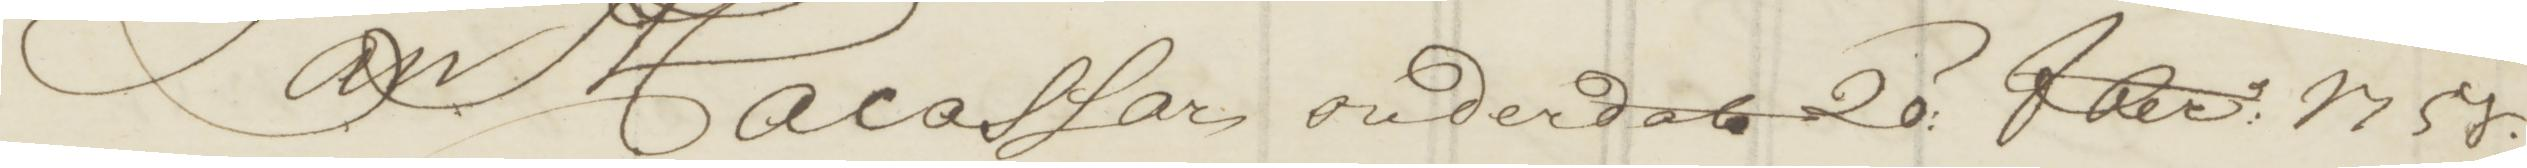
Van Macassar onder dato 20:' 8ber: 1757.
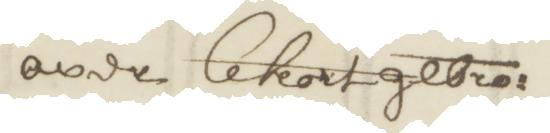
over tekort gebro:
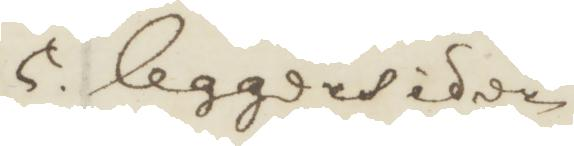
5. leggers ider
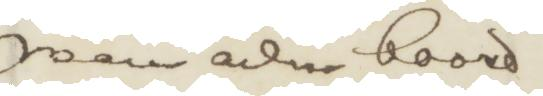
wan aen boord
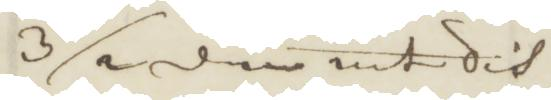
3½ en in't dis
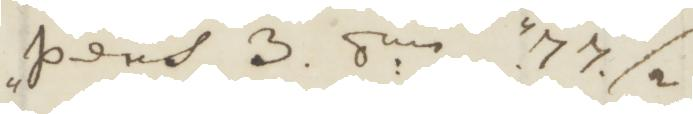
pens 3. d:m . . . 77.½
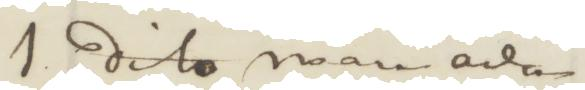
1. dito wan aen
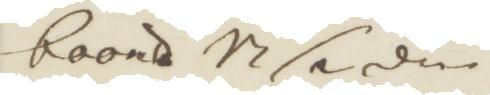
boord 17½ en
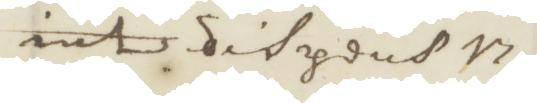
in 't dispens 17.
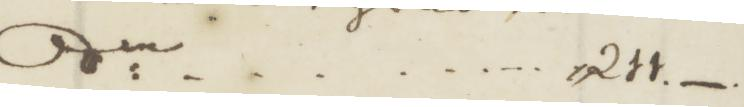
d:m- - - . . . - . „211.—
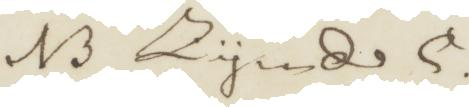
NB zijnde 5.
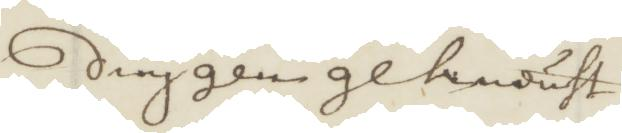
duijgen gekneust
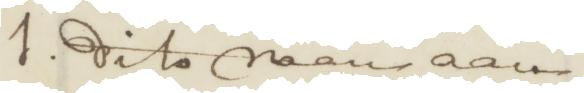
1. dito wan aan
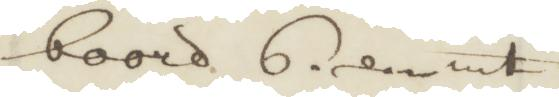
boord 6. en in 't
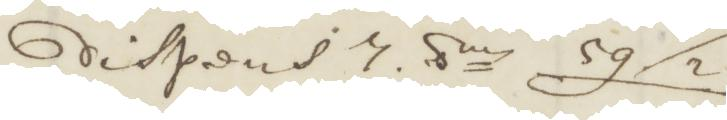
dispens 7. d=m 59½
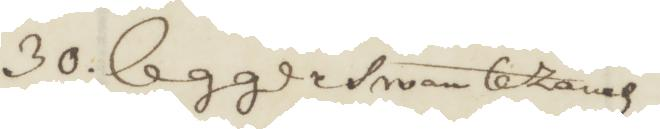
30. leggers wan tezamen
